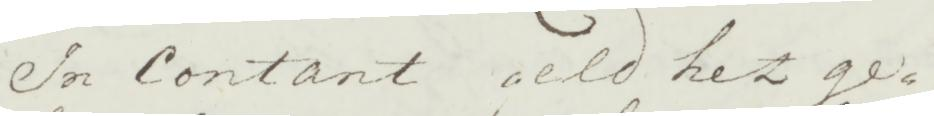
In Contant geld het ge„
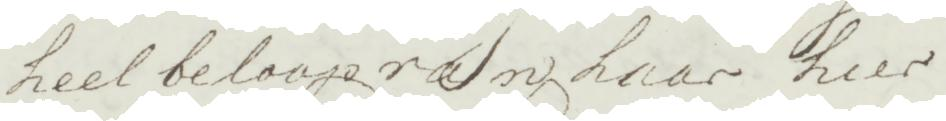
heel beloop van haar hier
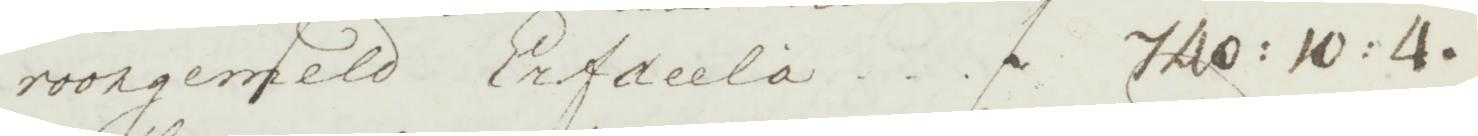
voorgemeld Erfdeel à - - - ƒ 740:10: 4.
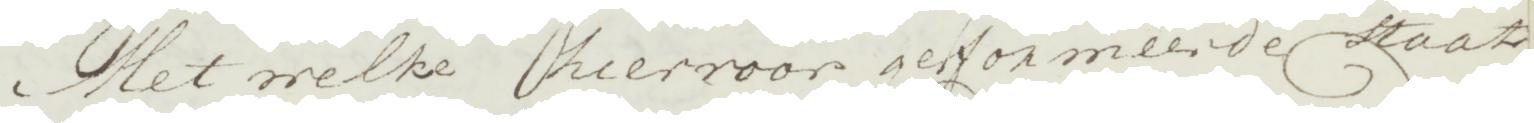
Met welke hiervoor geformeerde staat
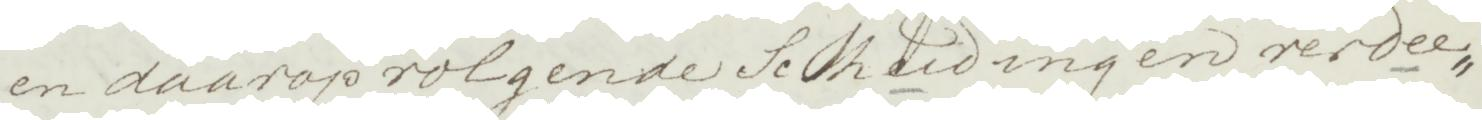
en daarop volgende scheidingen verdee„
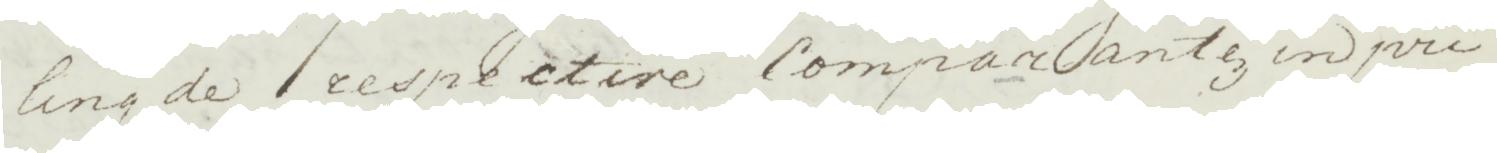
ling de respective Comparanten in pri
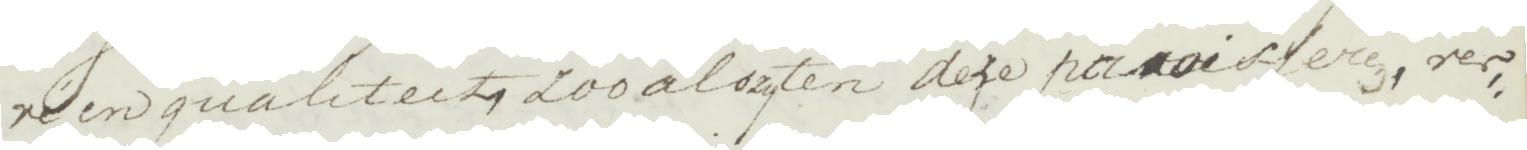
ve en qualiteit, zoo als zy ten deze paroisseren, ver„
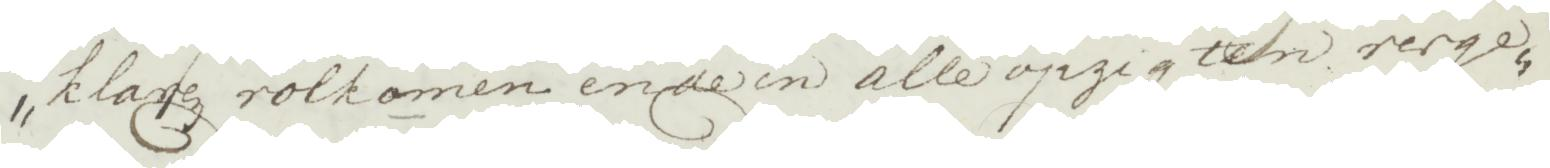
„klaren volkomen ende en alle opzigten verge„
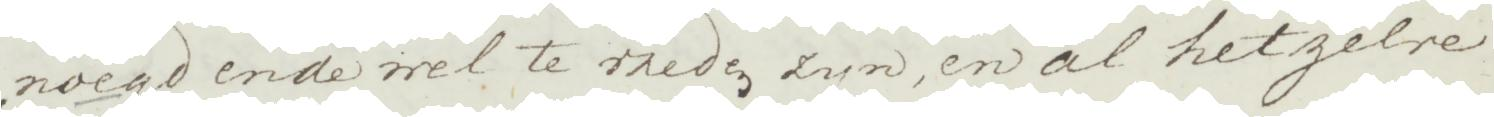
„noegd ende wel te vreden zyn, en al het zelve
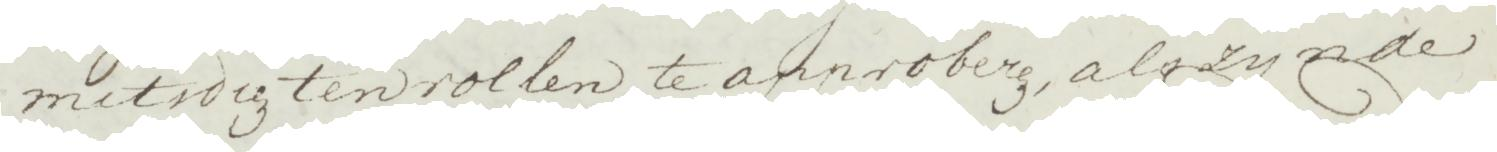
mitsdien ten vollen te approberen, als zynde
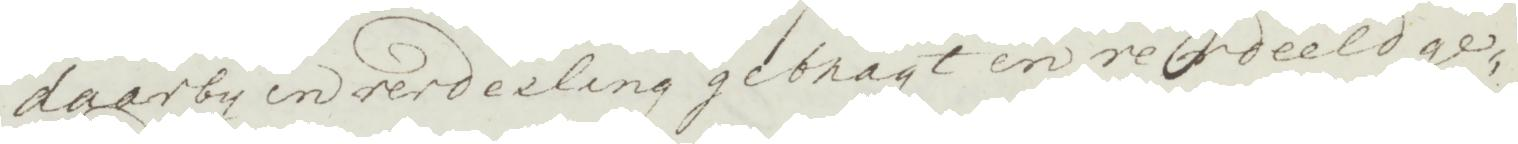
daarby in verdeeling gebragt en verdeeld ge„
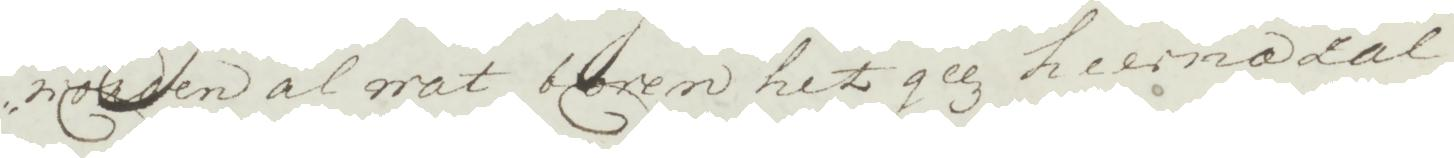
„worden al wat boven het geen hierna zal
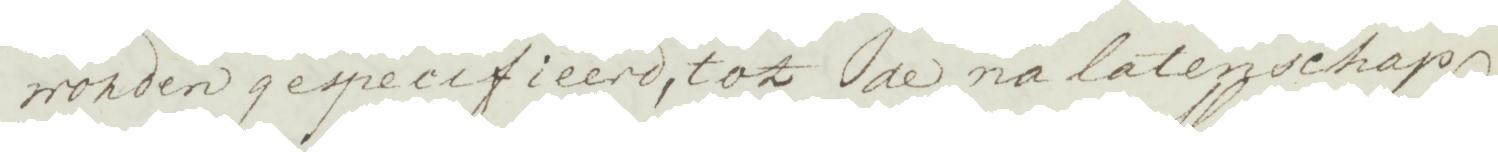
worden gespecifieerd, tot de nalatenschap
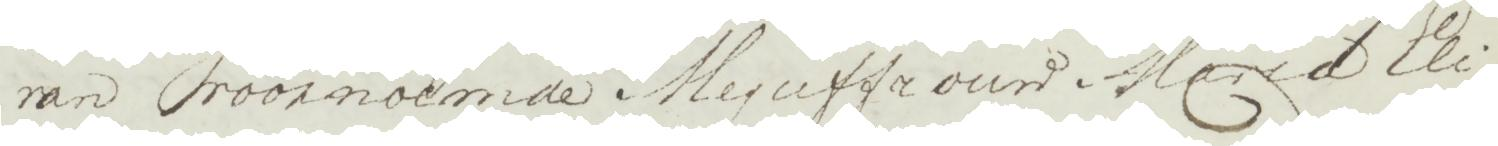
van voornoemde Mejuffrouw Maria Eli
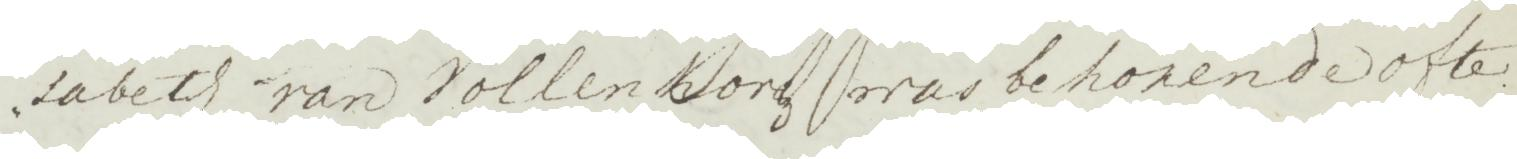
„zabeth van Vollenhoven was behorende ofte
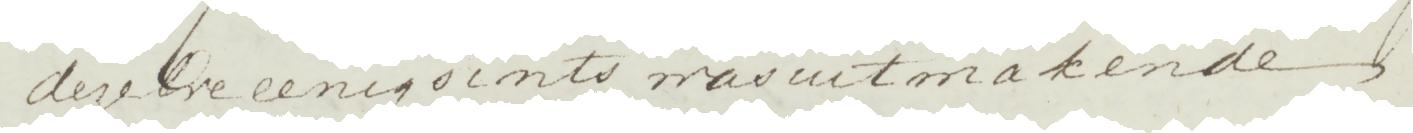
dezelve eenigsints was uitmakende
